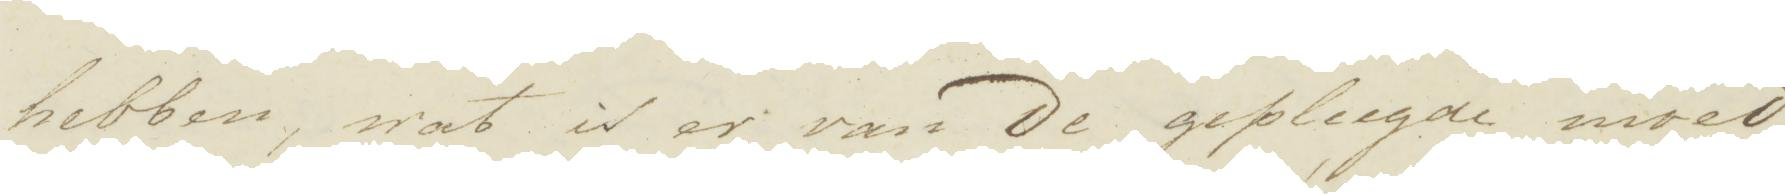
hebben, wat is er van de gepleegde moed
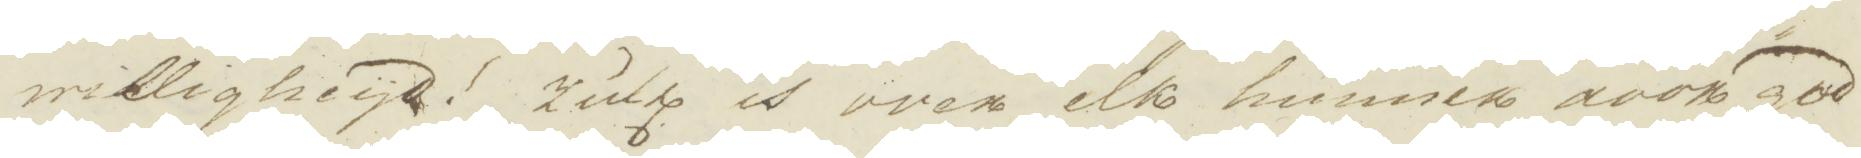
willigheijd ! zulx is over elk hunner door god
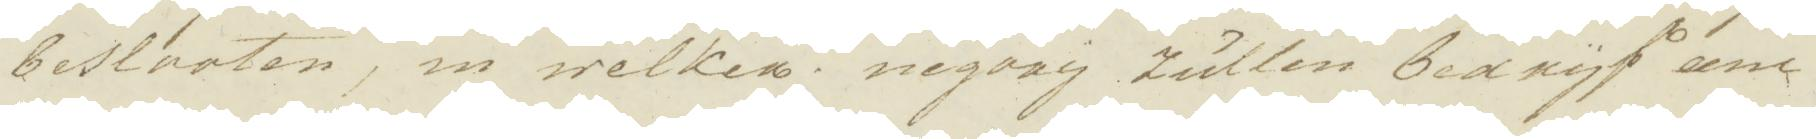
beslooten, in welker. negorij zullen bedrijf eene
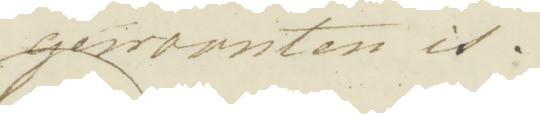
gewoonten is.
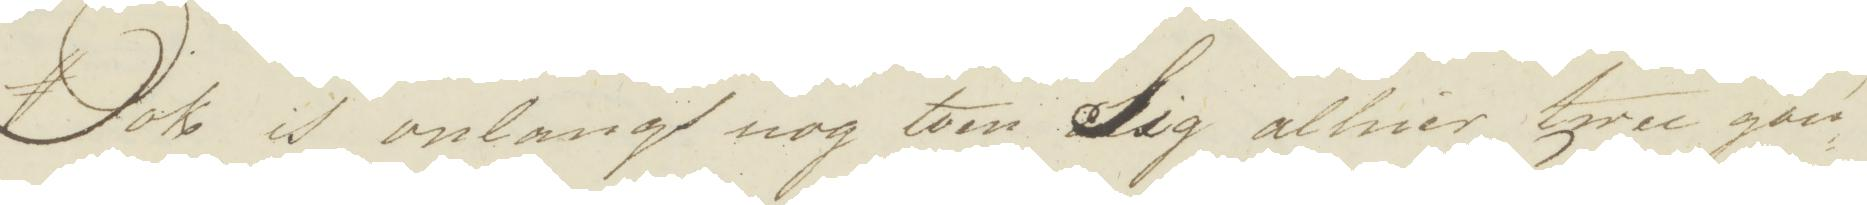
Ook is onlangs nog toen Sig alhier twee gou„
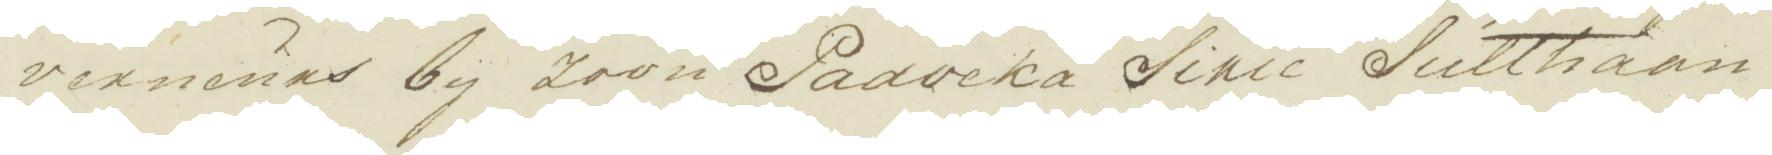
verneurs bij zoon Padoeka Siric Sulthaan
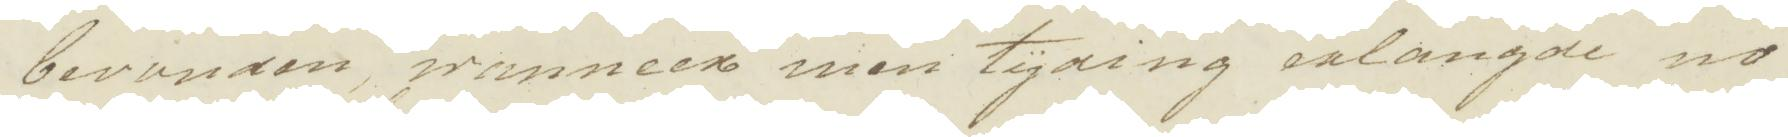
bevonden, wanneer men tijding erlangde no
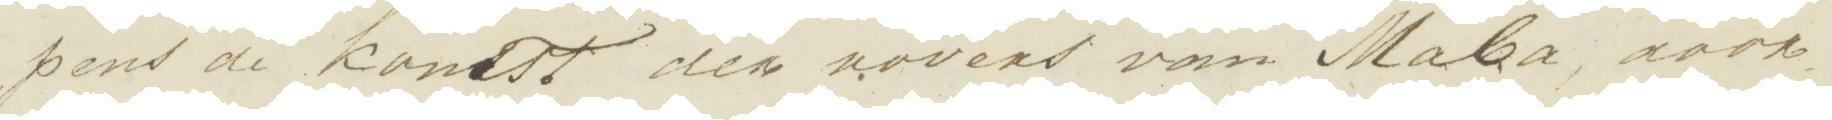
pens de komst der rovers van Maba, door
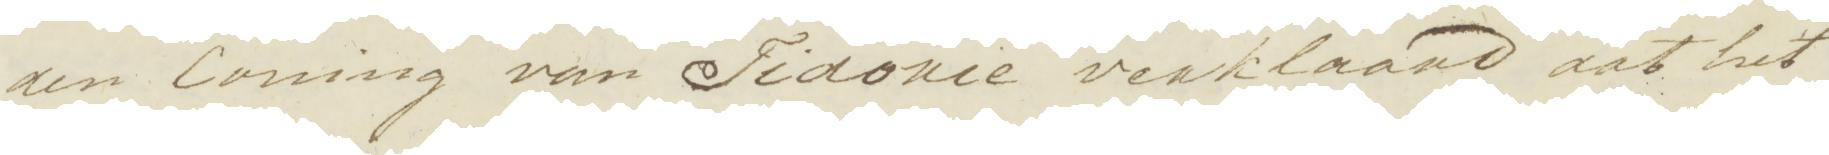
den Coning van Tidorie verklaard dat het
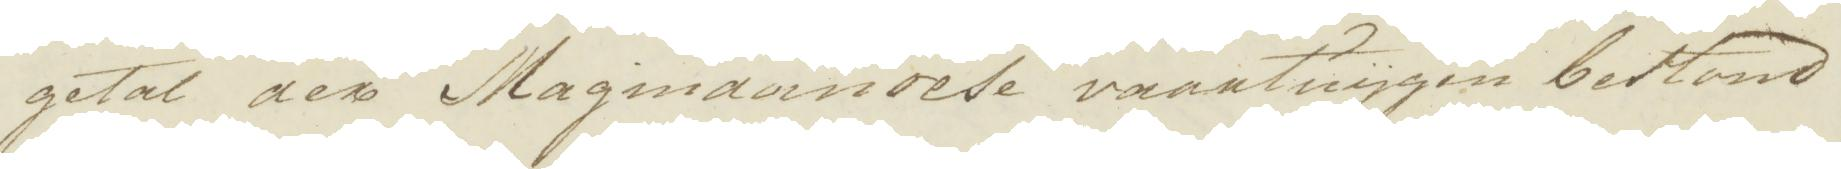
getal der Magindanoese vaartuijgen bestond
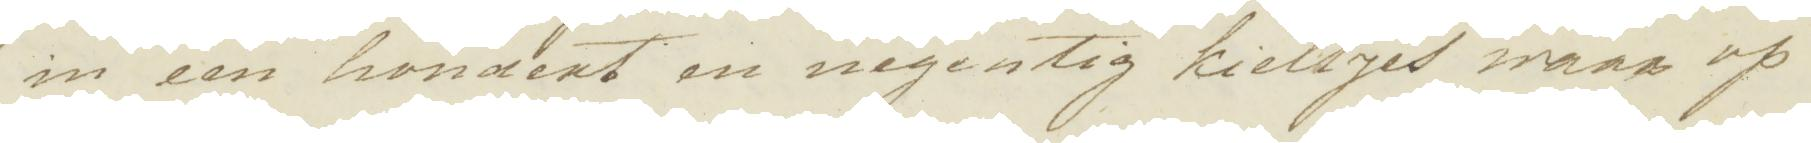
in een hondert en negentig kieltjes waar op
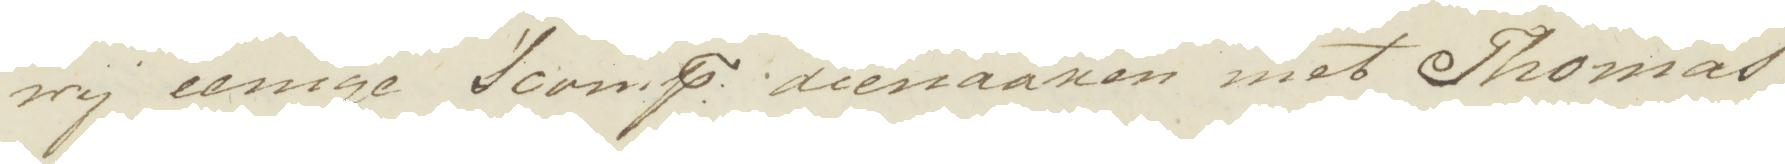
wij eenige 'Scomp: dienaaren met Thomas
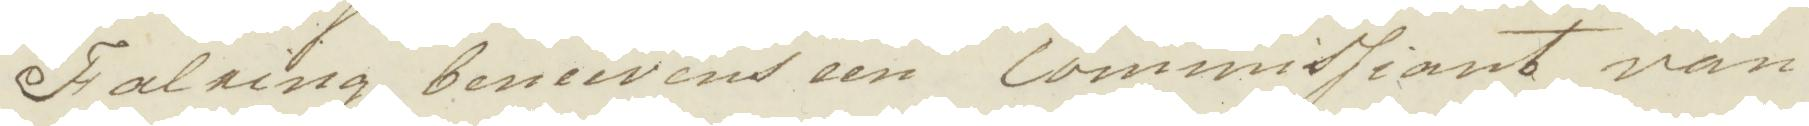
Falring beneevens een Commissiant van
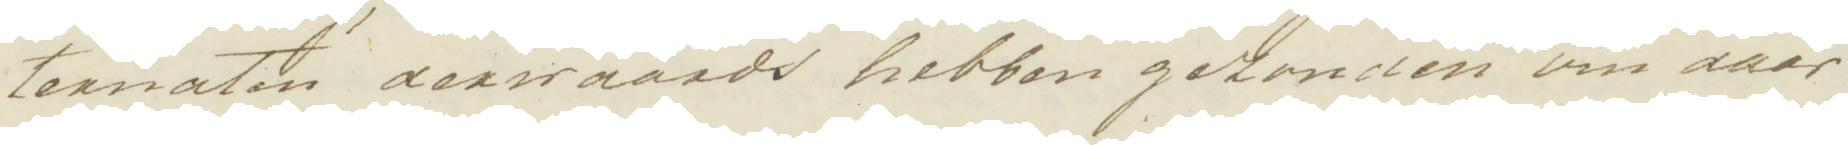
ternaten derwaards hebben gezonden om daar
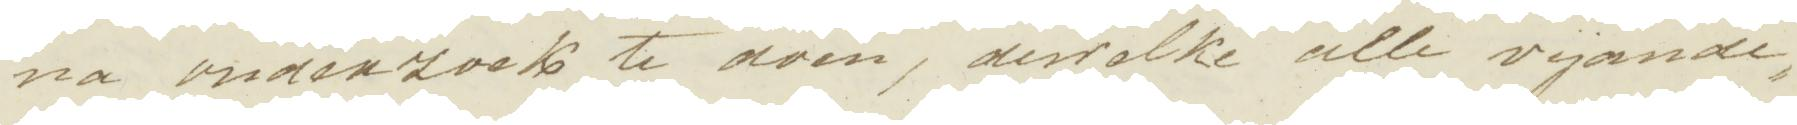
na onderzoek te doen, dewelke alle vijande„
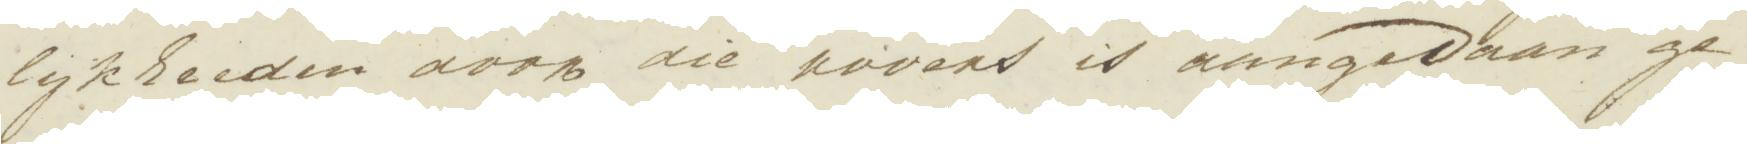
lijkheeden door die rovers is aangedaan ge
